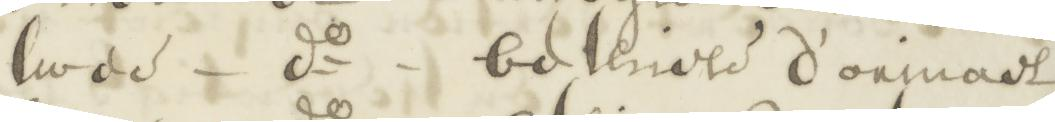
twee - d=o - bethiele d’ orinael
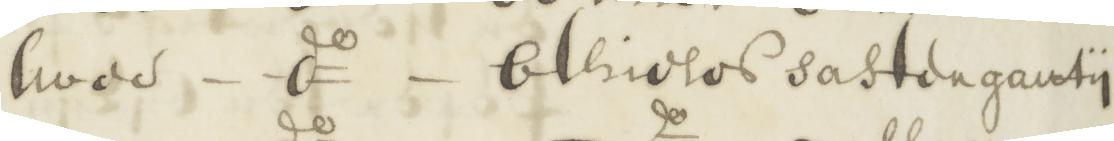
twee - d=o - bthieles saster gantij
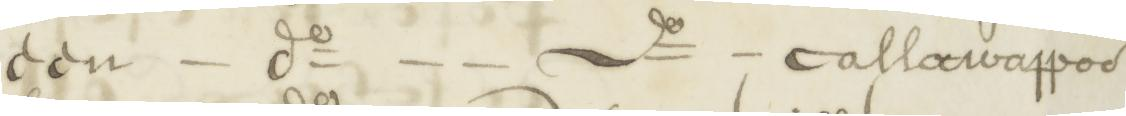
een - d=o - - D=o - callawappos
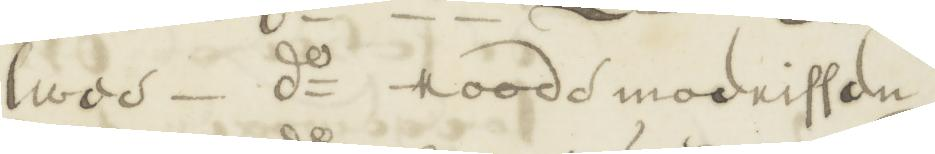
twee - d=o roode moerissen
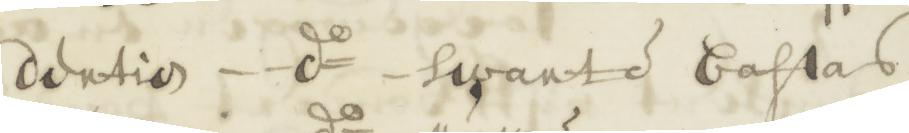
dertien - d=o - swarte baftas
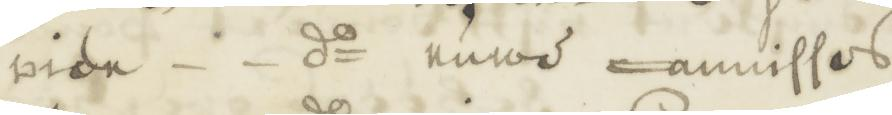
vier - - d=o ruwe cannisses
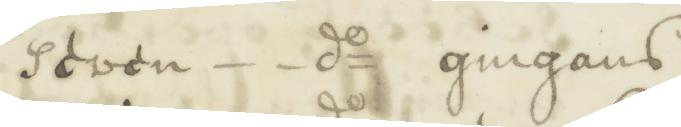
seven - - d=o gingans
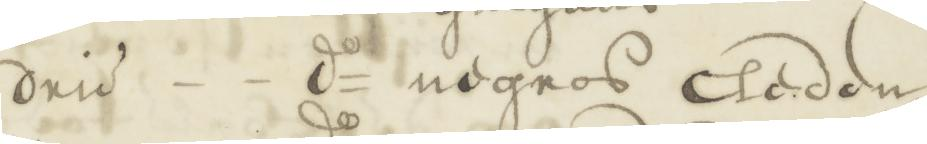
drie - - d=o negros cleden
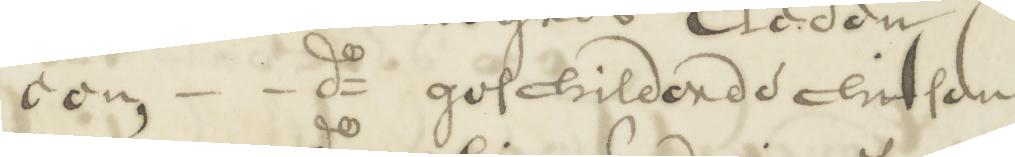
een - - d=o geschilderde chitsen
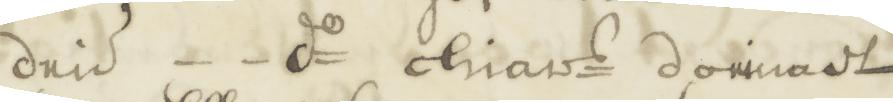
drie - - d=o chiav=s dorinael
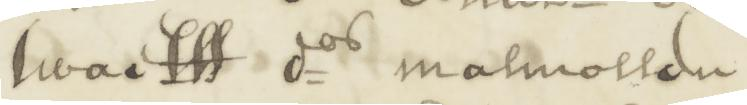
twaelff d=os malmollen
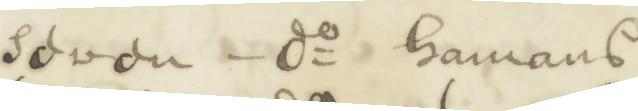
seven - d=o d=o hamans
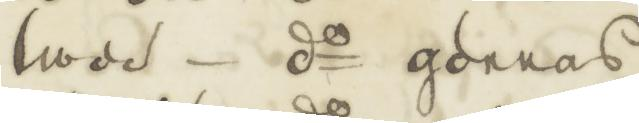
twee - d=o gerras
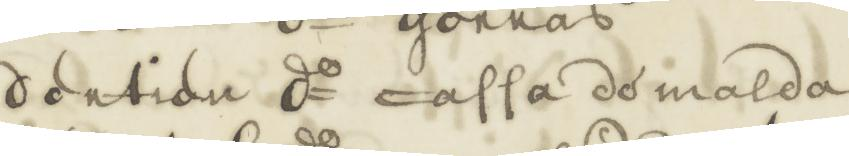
dertien d=o cassa de malda
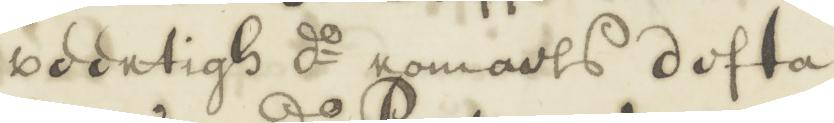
veertigh d=o nomaels defta
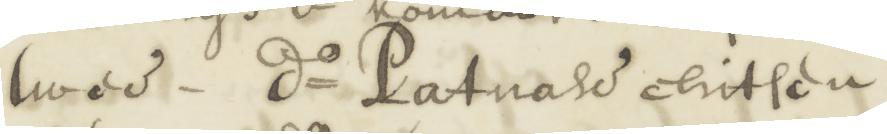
twee - d=o Patnase chitsen
